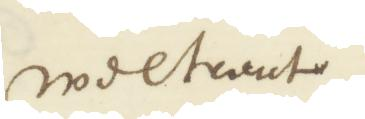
welkent
